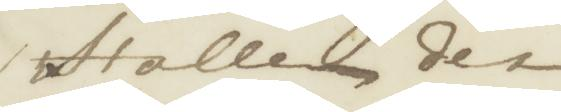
„stallen der
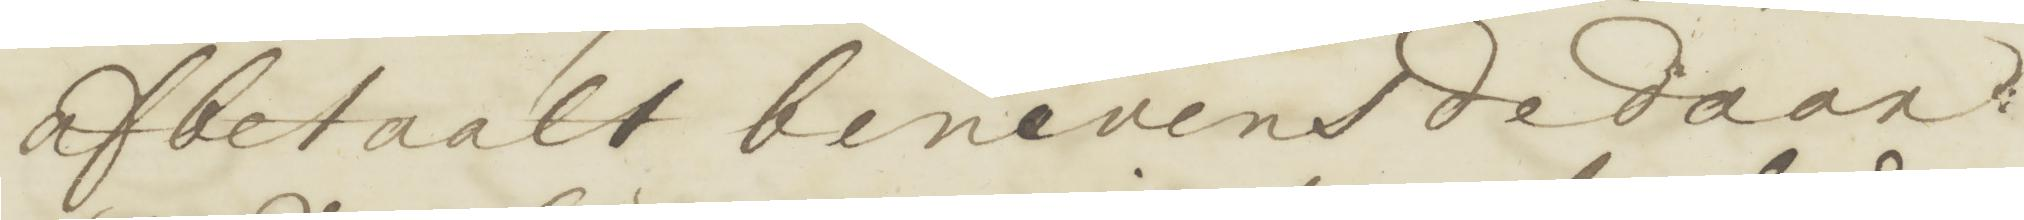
afbetaalt benevens de daar
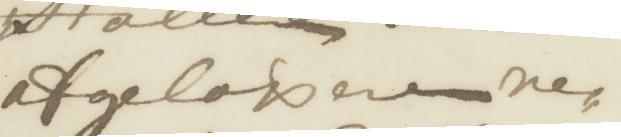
afgelopen ne„
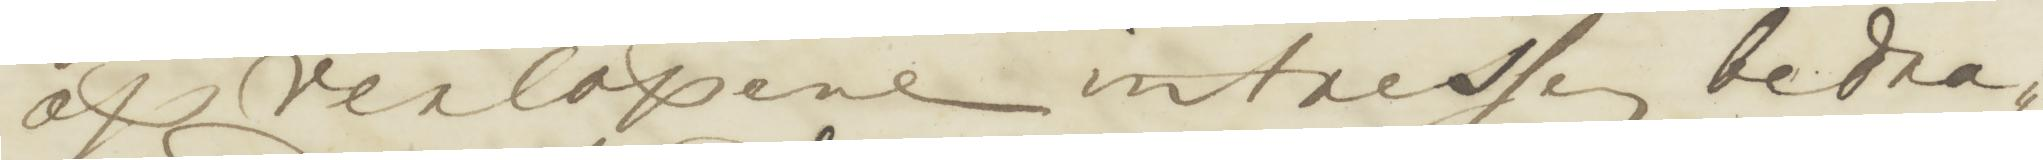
op verlopene intressen bedra„
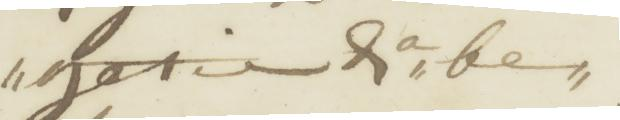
„gotie &„a be„
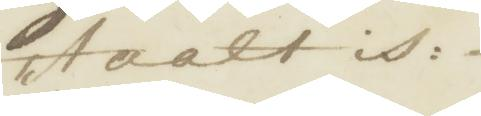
„taalt is:
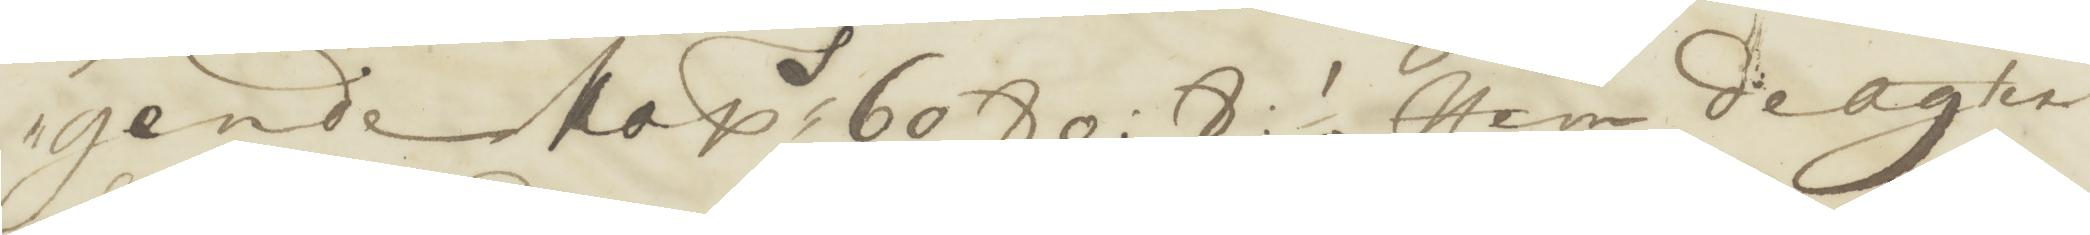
„gende kop„s 6080: 8:1/5 jtem de agter
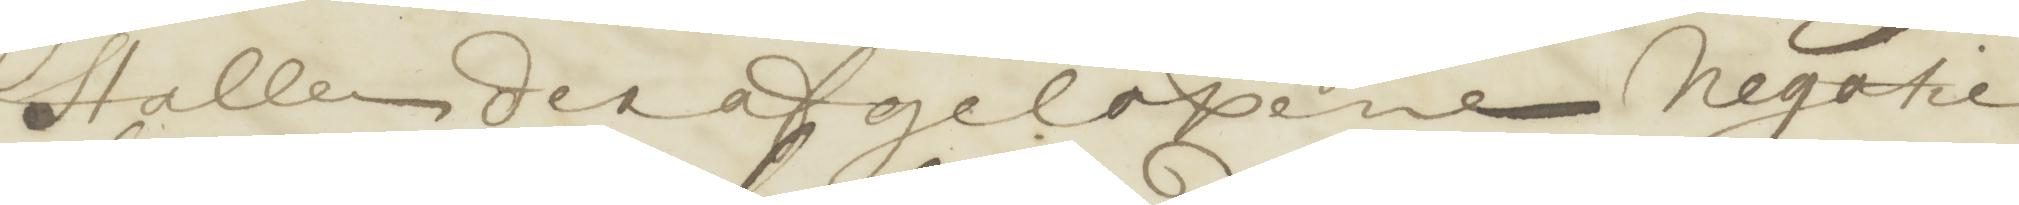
stallen der afgelopene negotie
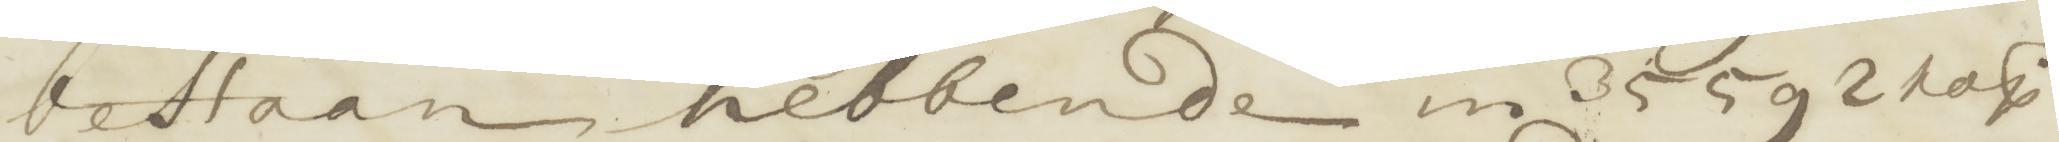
bestaan hebbende in 35592 rops
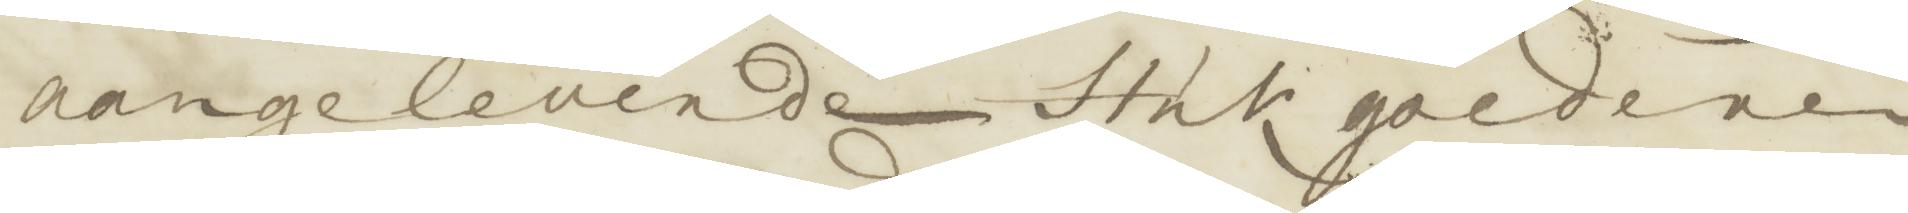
aangeleverde stuk goederen
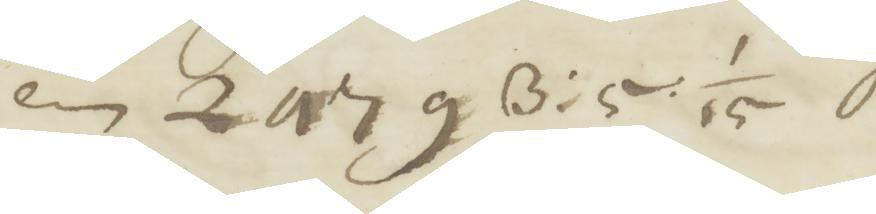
en 24793:5. 1/15 d=tos aanzijde, waar
